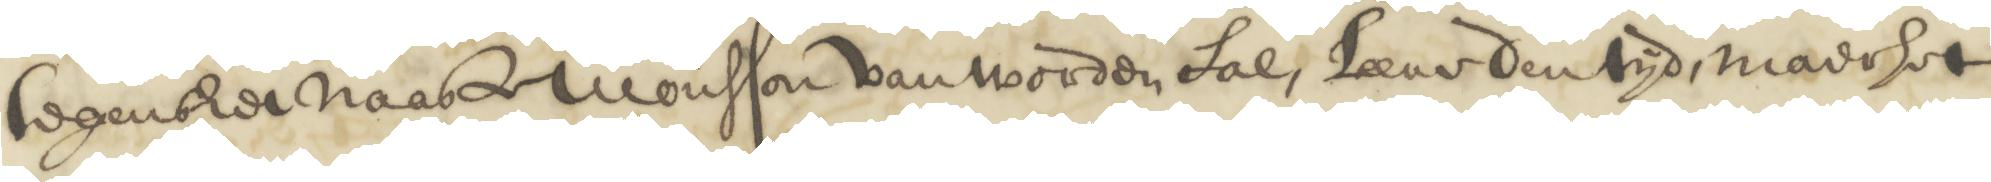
tegens het naaste mousson van worden sal, Leere den tijd, maer het
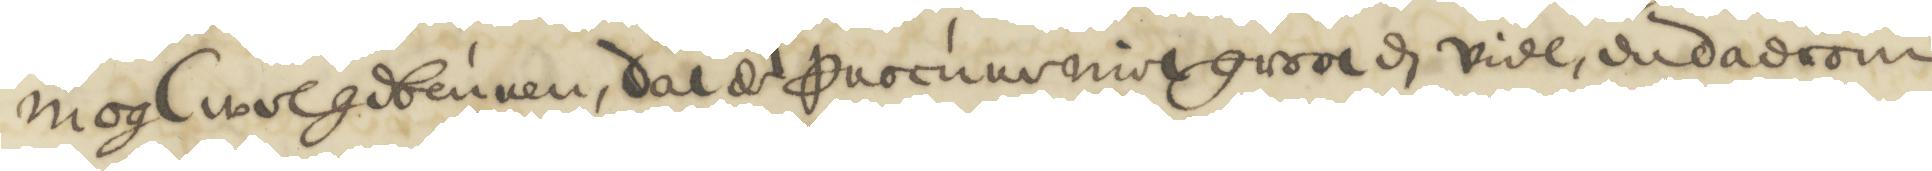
mogt wel gebeuren, dat de procure niet groot en viel, en daerom
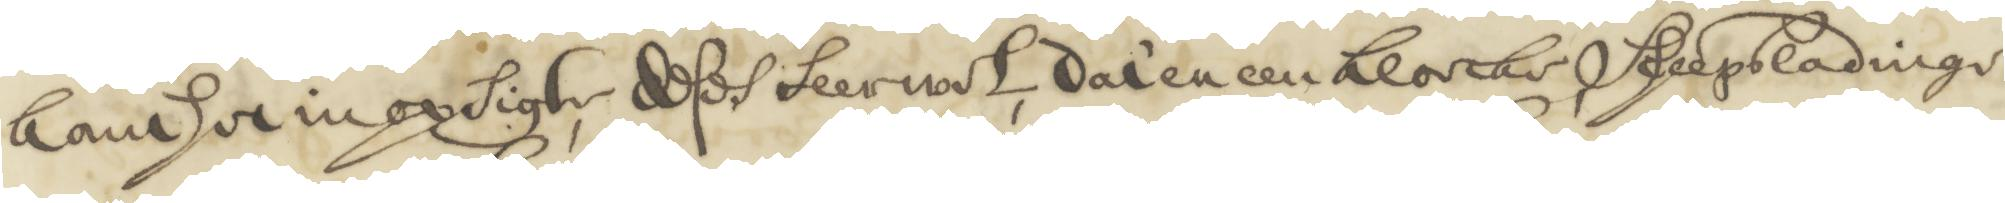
komt het in opsigte deses seer wel, dat 'er een kloecke scheepsladinge
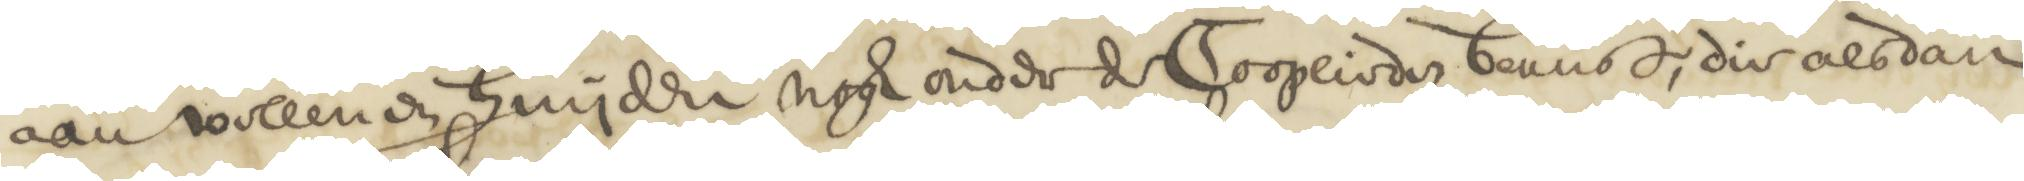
aan weleen en huijden nogh onder de Cooplieden berust, die als dan
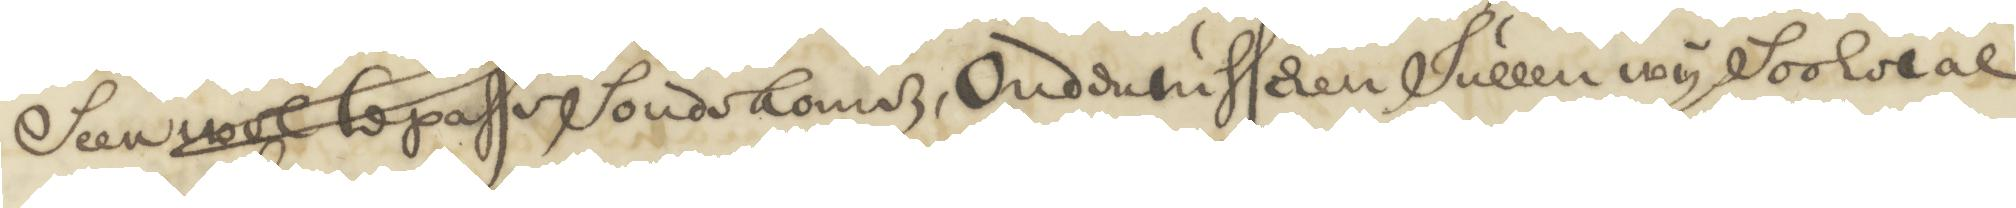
seer wel te passe soude komen, Ondertusschen sullen wij soo het al
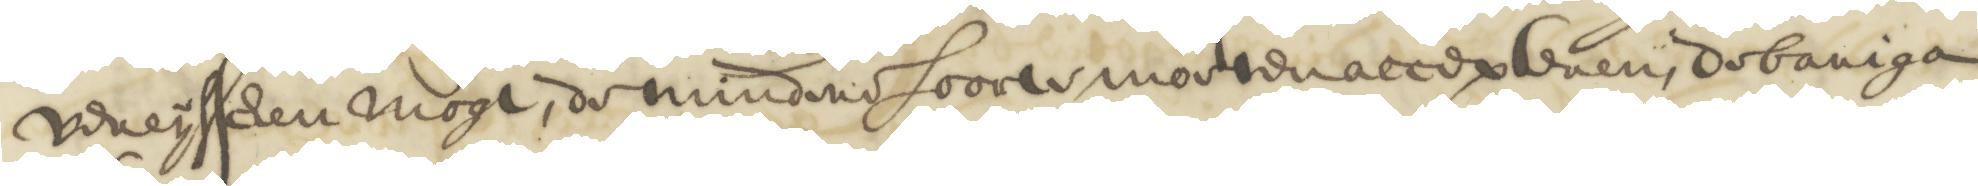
vereijsschen mogt, de mindere soorte moeten accepteren, debariga
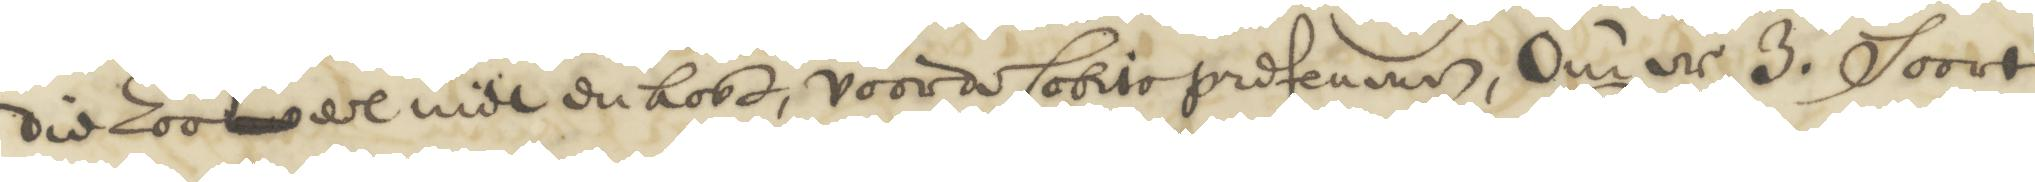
die zoo veel niet en kost, voor de Cobito prefereren, Om 'er 3. soort
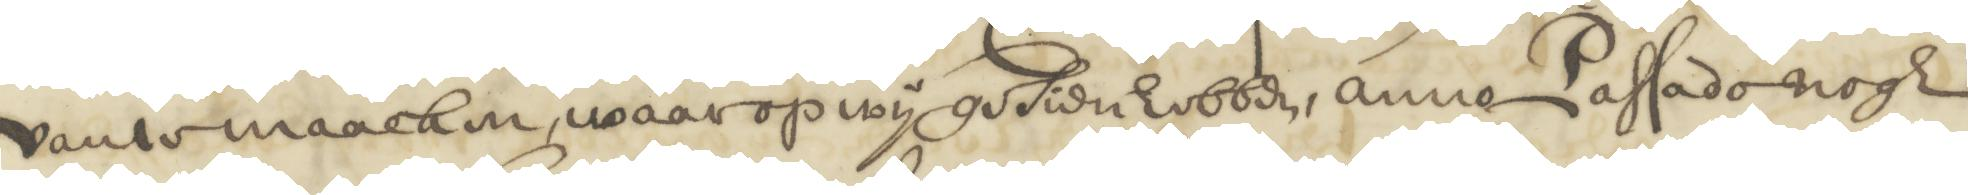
van te maacken, waar op wij gesien hebben, anno Passado nogh
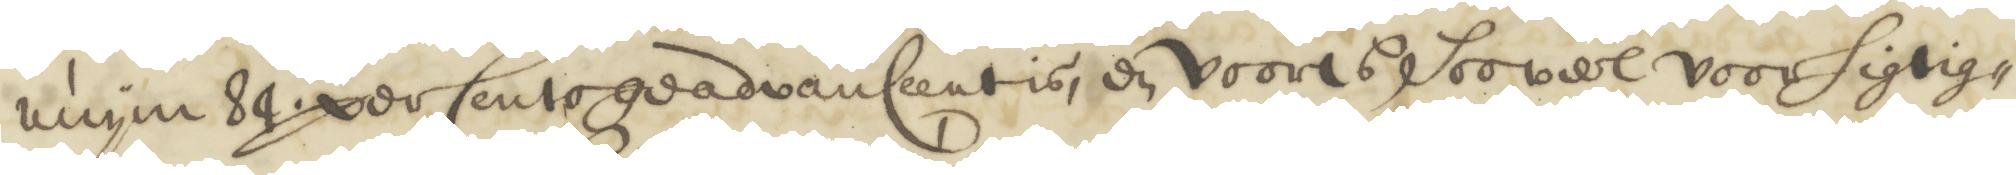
ruijm 84. per Cento geadvanceert is, en voorts soo veel voorsigtig„
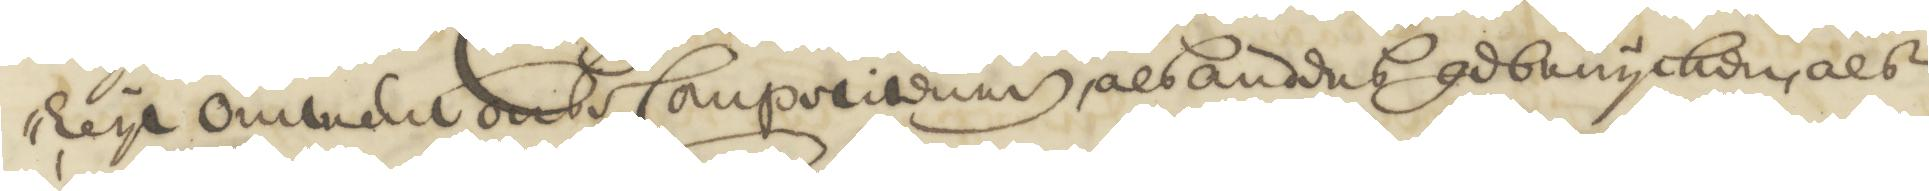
„heijt omtrent onse Competiteuren, als anders gebruijcken, als
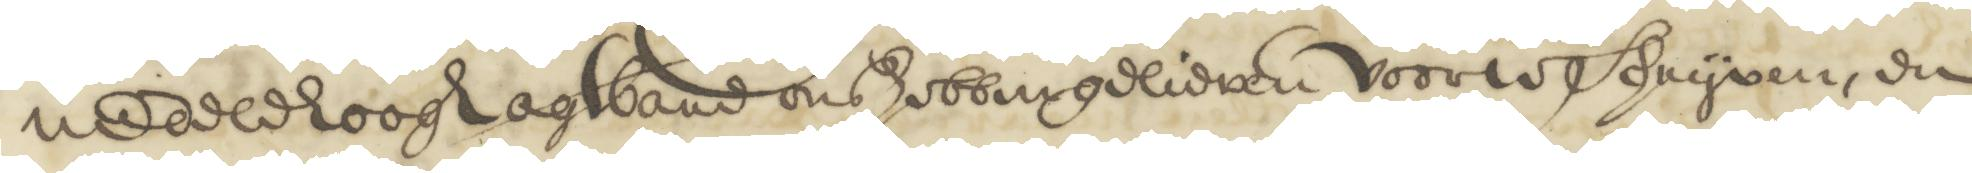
uEdele hoogh agtbare ons hebben gelieven voor te schrijven, en
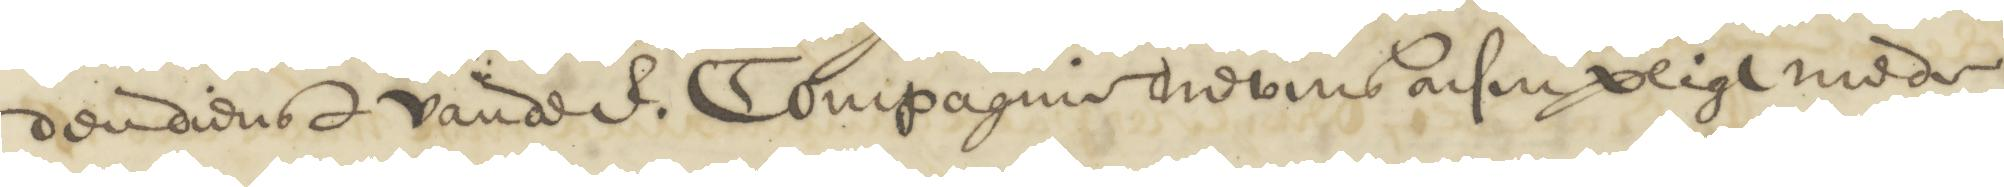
den dienst vande E. Compagnie nevens onsen pligt mede
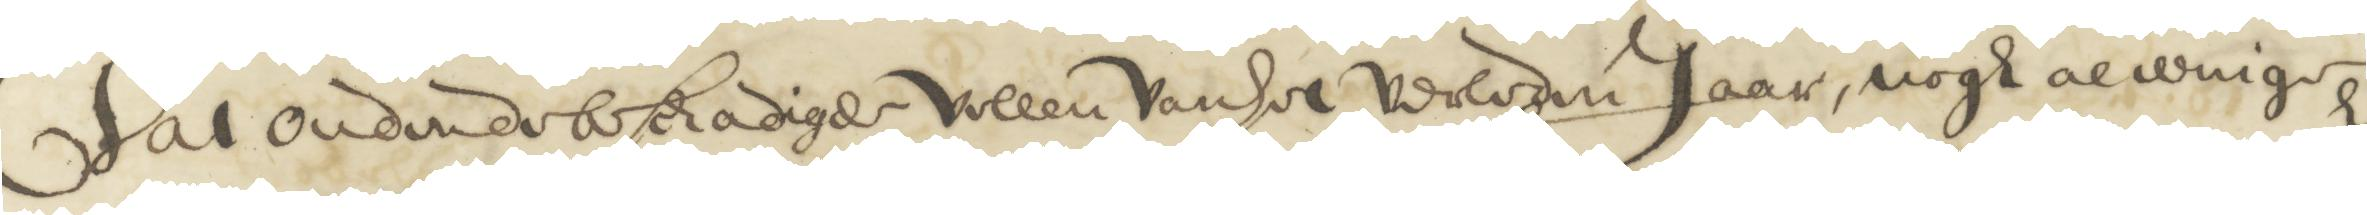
Dat onder de beschadigde vellen van het verleden Jaar, nogh al eenige
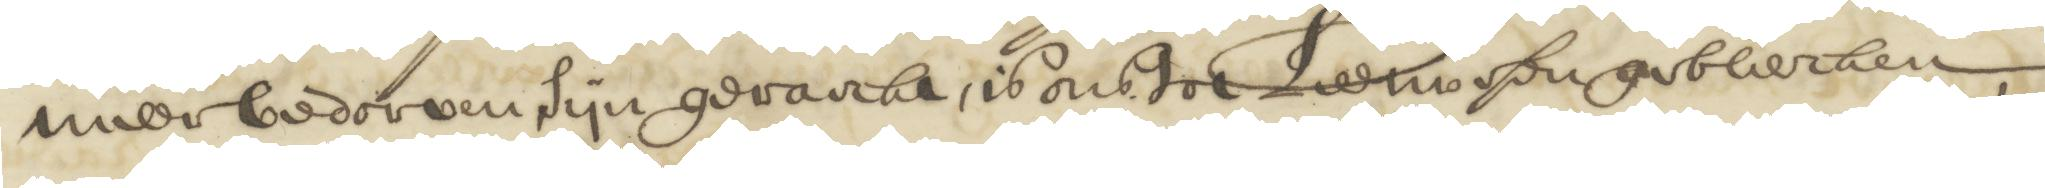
meer bedorven sijn geraeckt, is ons tot leetwesen gebleecken,
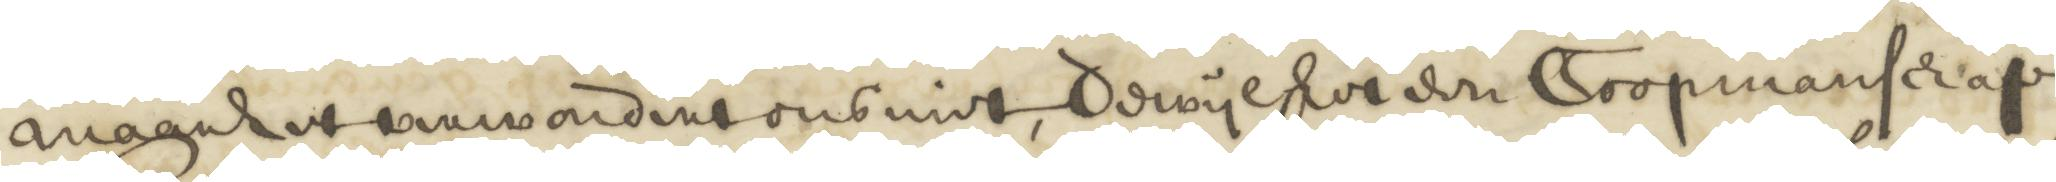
maar het verwondert ons niet, dewijl het een Coopmanschap
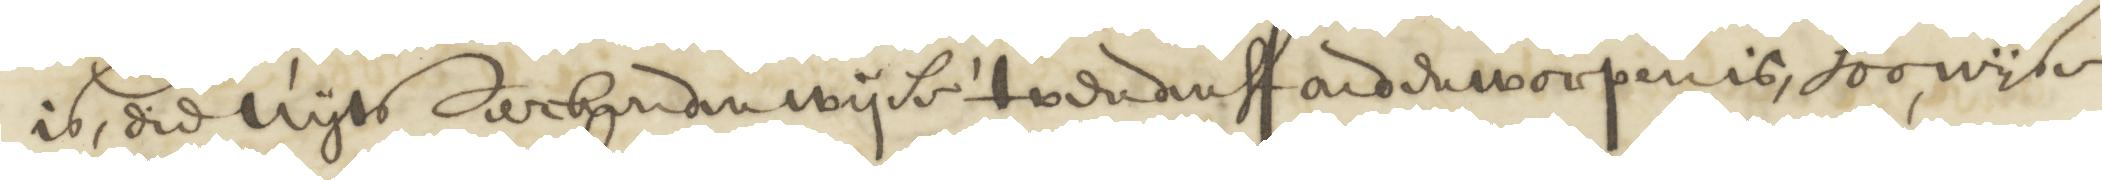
is, die uijtsteecken der wijse ’t verderff onderworpen is, soo wijse
